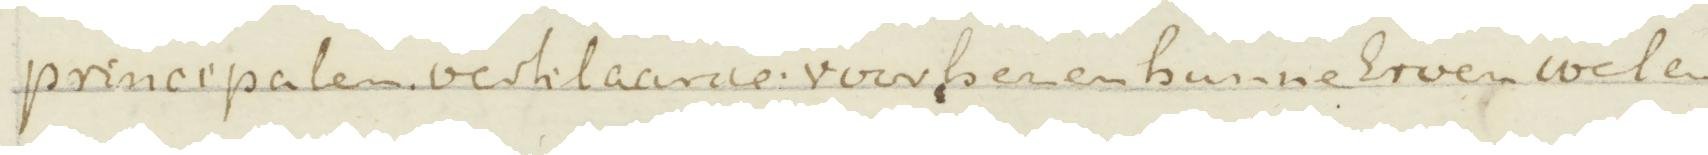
principalen verklaarde voor hen en hunne Erven wel en
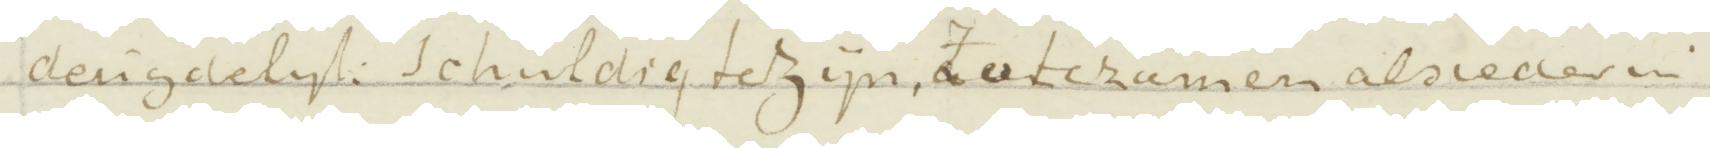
deugdelyk schuldig te zijn, zo tezamen als ieder in
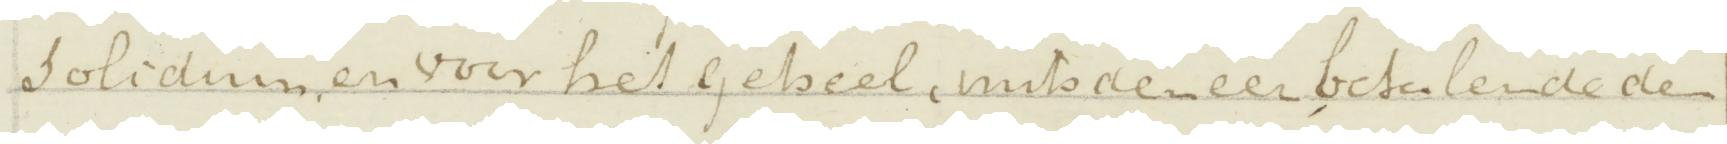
solidum, en voor het geheel, mits den een betalende den
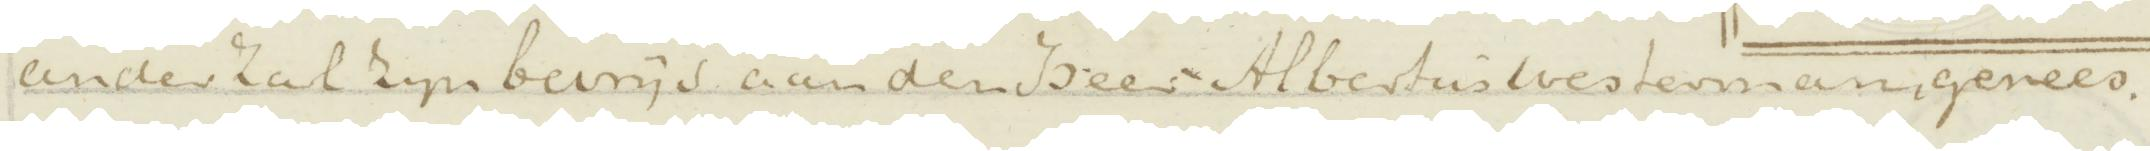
ander zal zyn bevrijd aan den Heer Albertus westerman, genees.
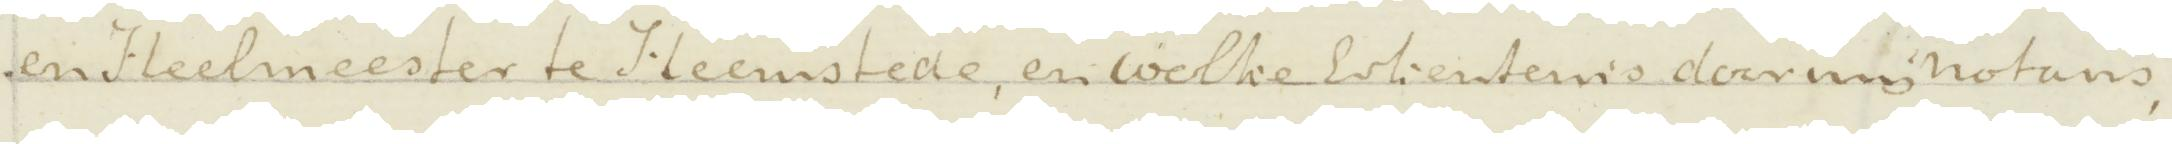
-en Heelmeester te Heemstede, en welke Erkentenis door mij notaris,
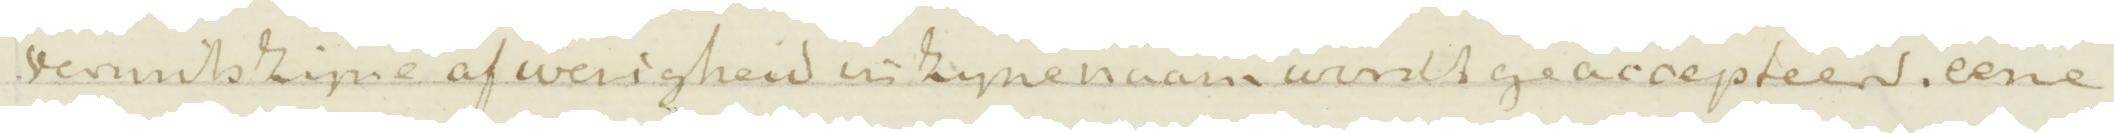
vermits zijne afwezigheid in zyne naam wordt geacceepteerd. eene
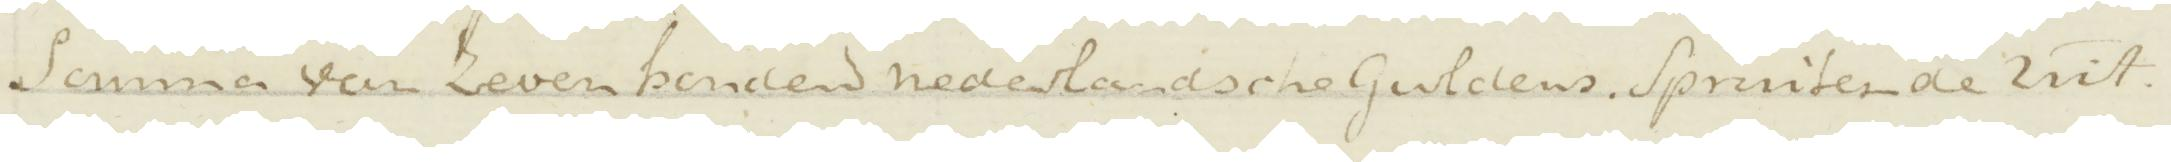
somma van zevenhonderd nederlandsche Guldens. Spruitende uit.
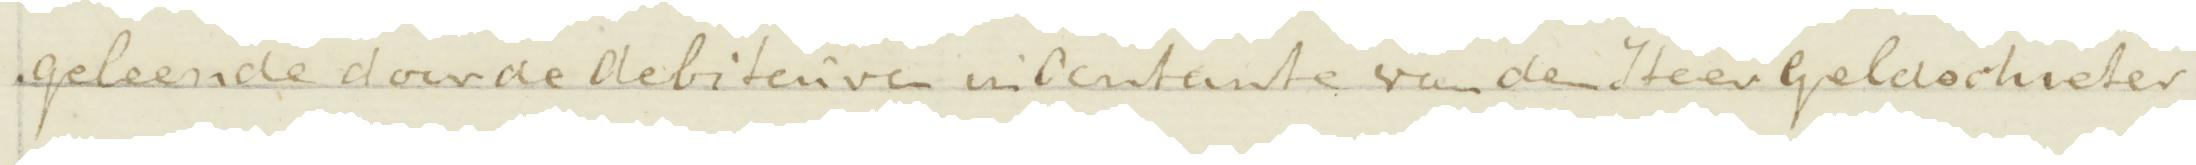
.geleende door de debiteuren in contante van de Heer geldschieter
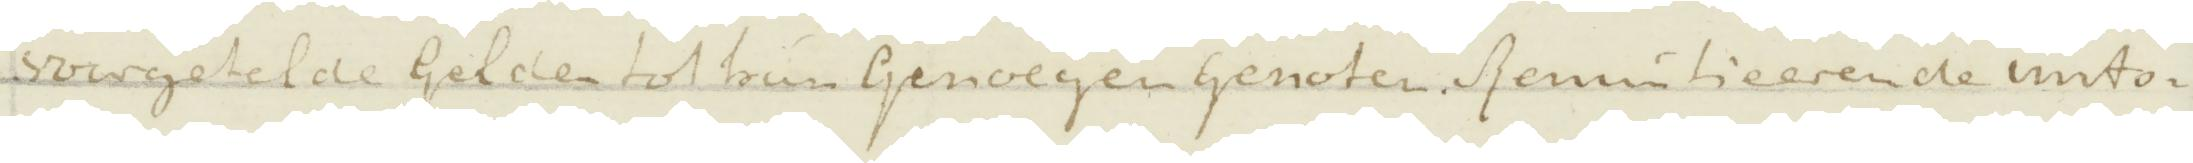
voorgetelde Gelden tot hun Genoegen Genoten. Renuntieerende mits=
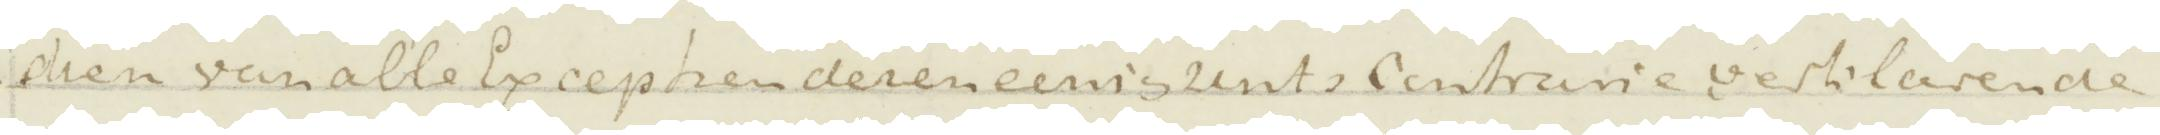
-dien van alle Exceptien dezen eenigzints contrarie, verklarende
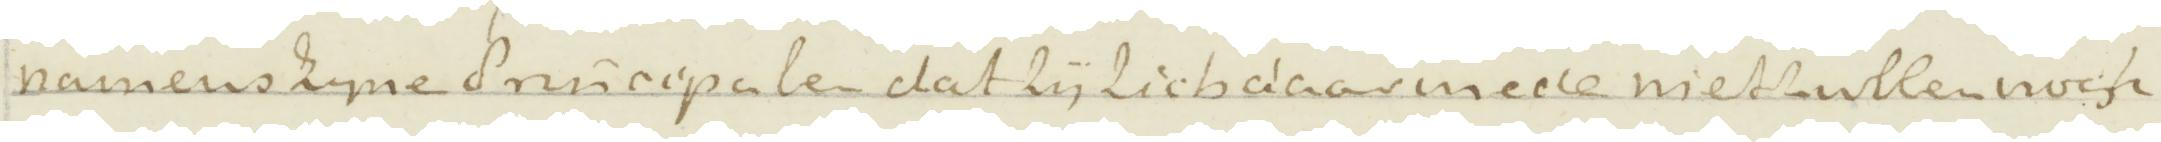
namens zyne Principalen dat zij zich daar mede niet zullen noch
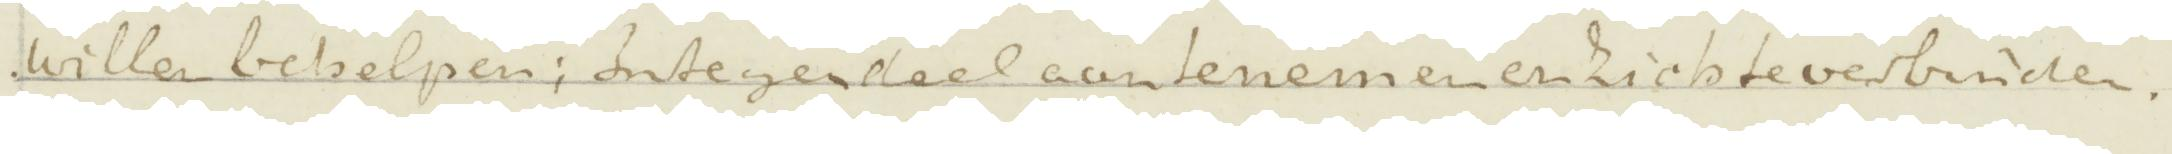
willen behelpen; Jntegendeel aantenemen en zich te verbinden.
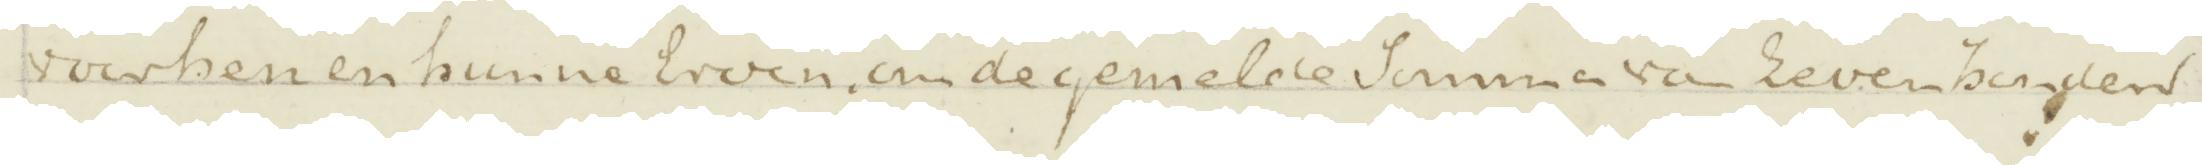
voor hen en hunne Erven, om de gemelde Somma van zeven honderd
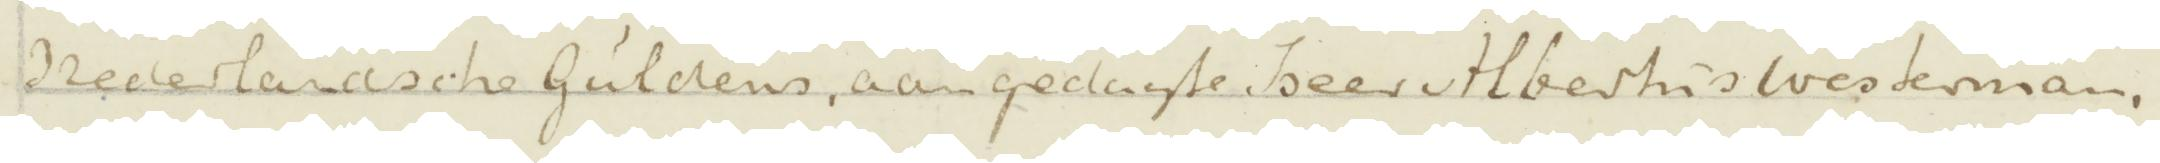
Nederlandsche Guldens, aan gedagte Heer Albertus westerman,
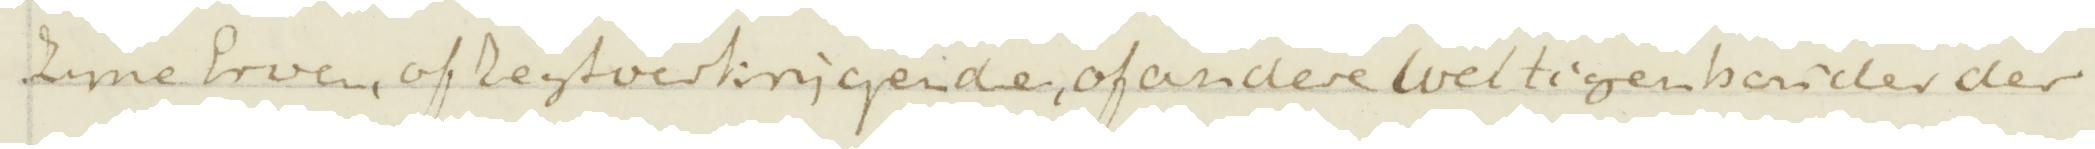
zyne Erve, of regtverkrijgende, of andere wettigen houder der
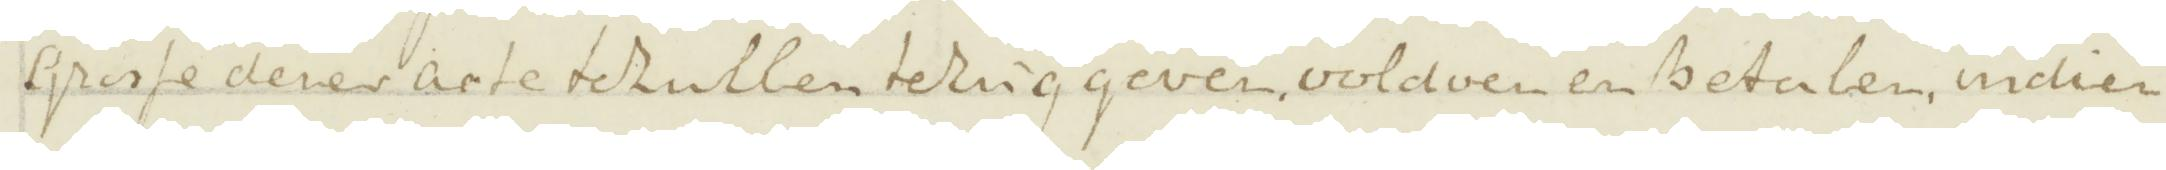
Grosse dezer acte te zullen terug geven, voldoen en Betalen, indien
